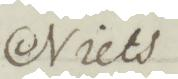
Niets
